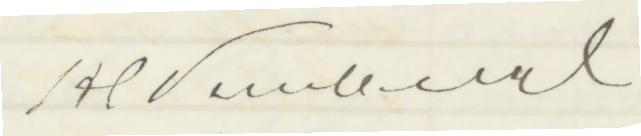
H Tombergh
